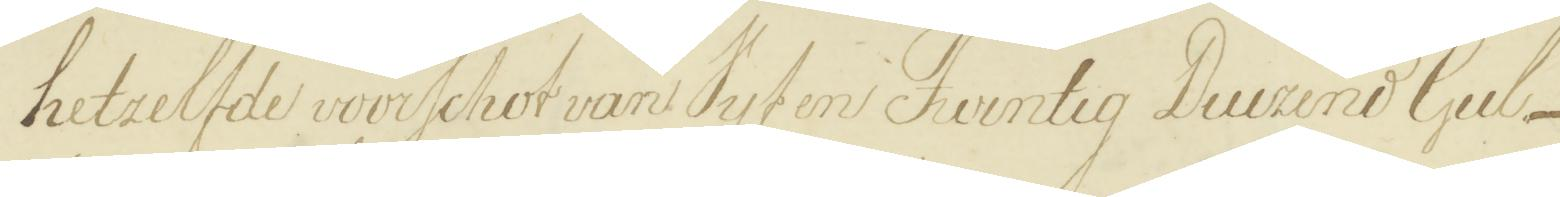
hetzelfde voorschot van Vyf en Twintig Duizend Gul
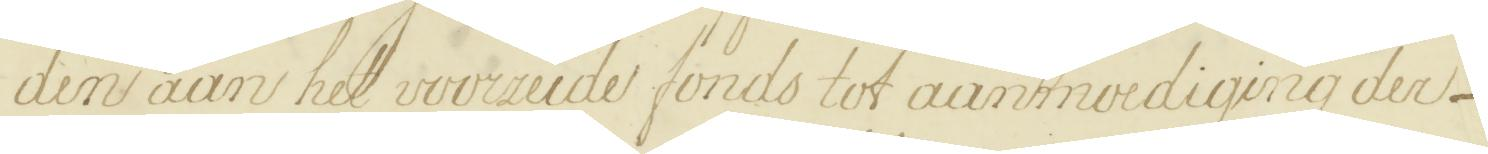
den aan het voorzeide fonds tot aanmoediging der
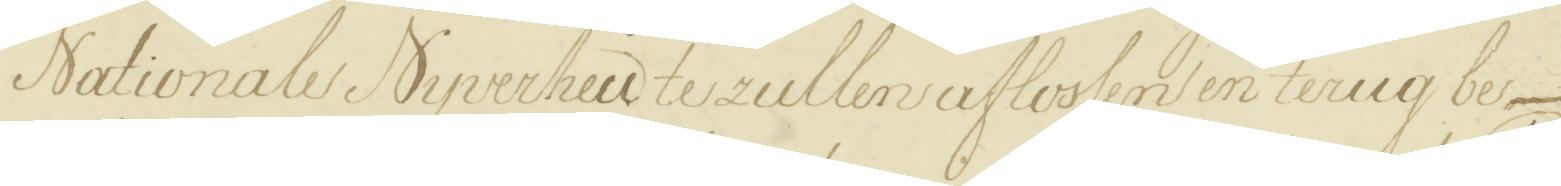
Nationale Nyverheid te zullen aflossen en terug be
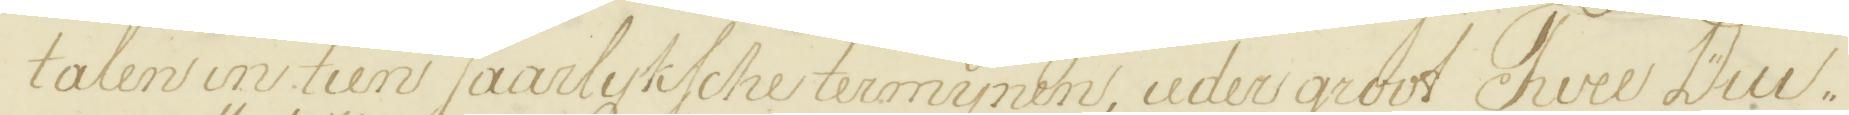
talen in tien Jaarlyksche termijnen, ieder groot Twee Dui„
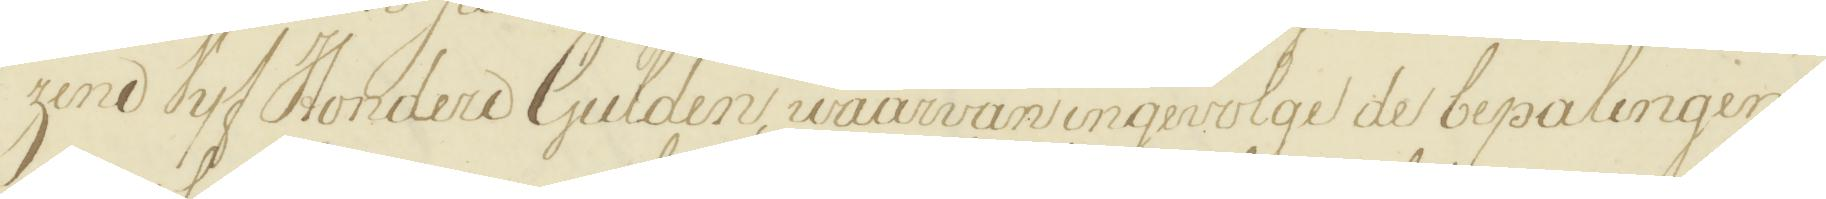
rend Vyf Honderd Gulden, waarvan ingevolge de bepalingen
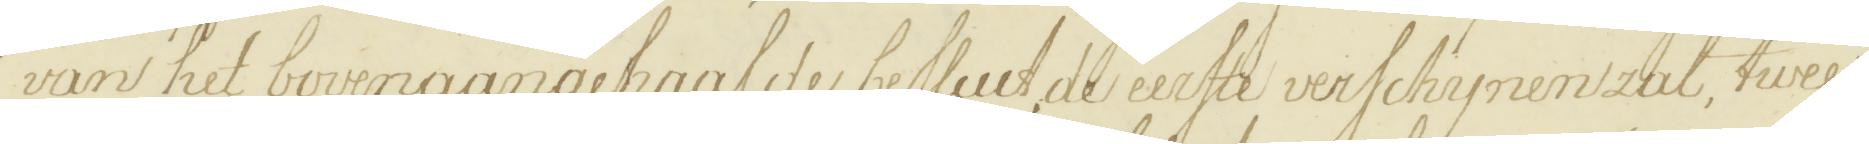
van het bovenaangehaalde besluit de eerste verschynen zal, twee
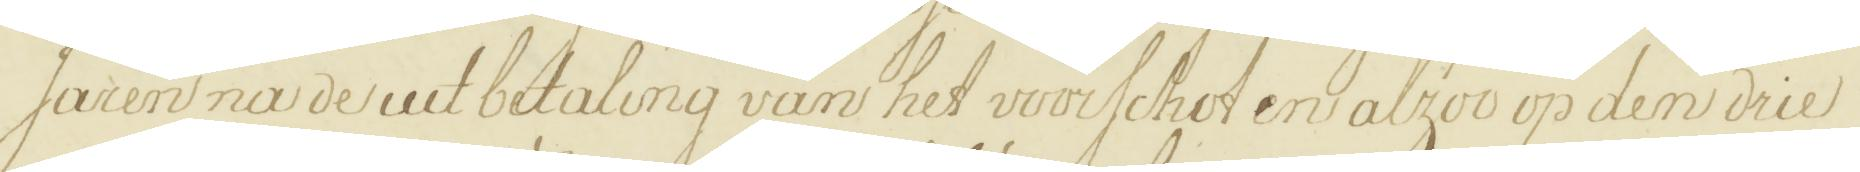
Jaren na de uit betaling van het voorschot en alzoo op den drie
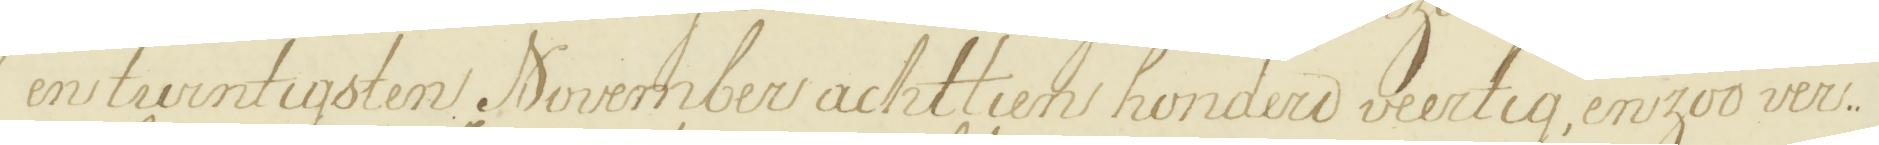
en twintigsten November achttien honderd veertig, en zoo ver„
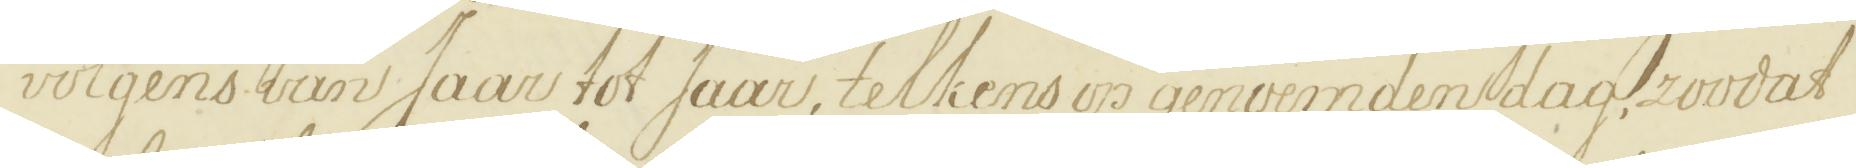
volgens van Jaar tot Jaar, telkens op genoemden dag zoodat
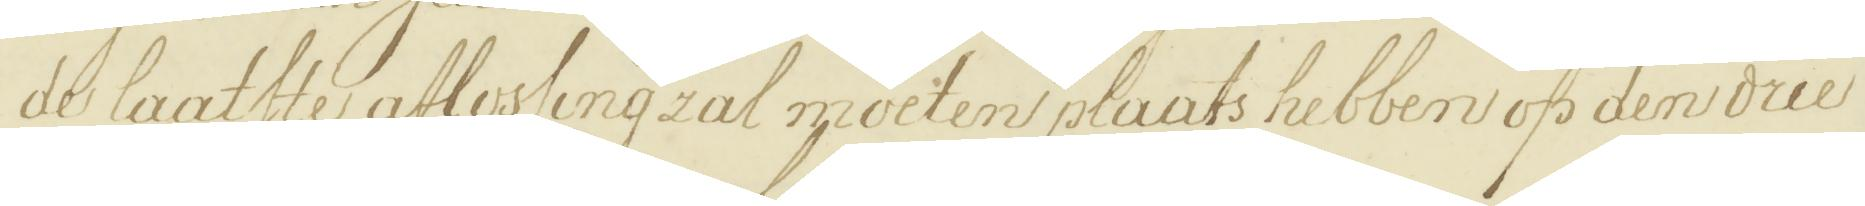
de laatste aflossing zal moeten plaats hebben op den drie
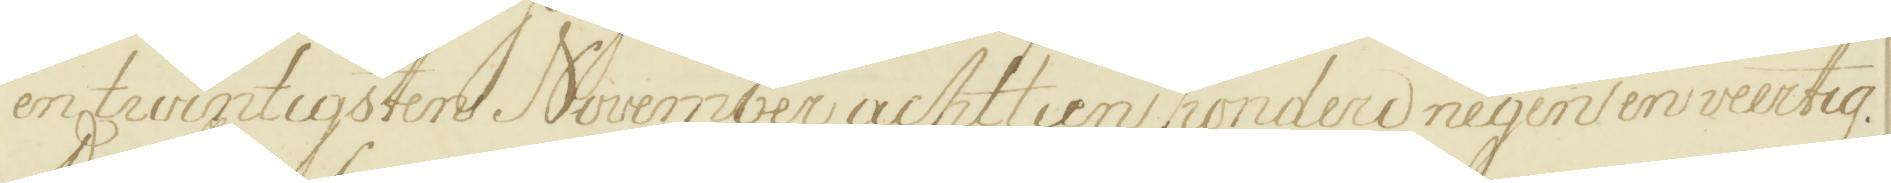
en twintigsten November achttien honderd negen en veertig.
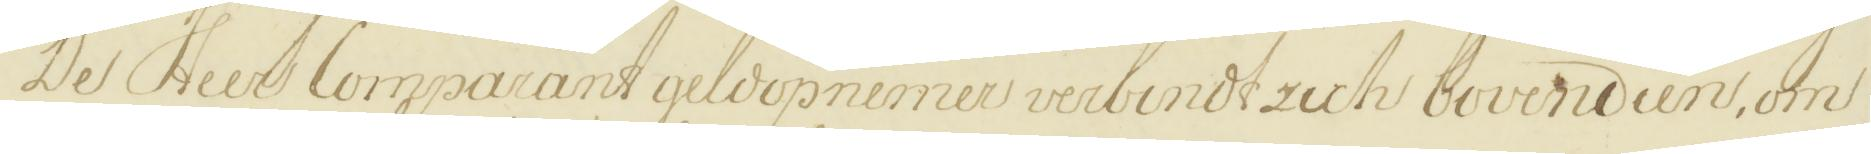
De Heer Comparant geldopnemer verbindt zich bovendien, om
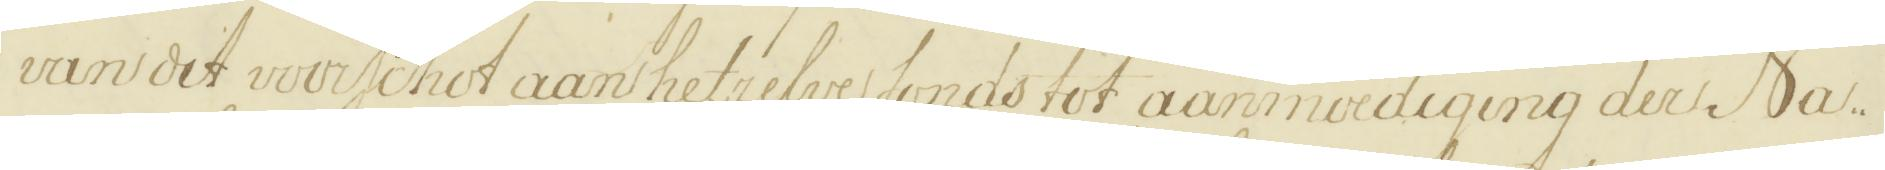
van dit voorschot aan hetzelve fonds tot aanmoediging der Na„
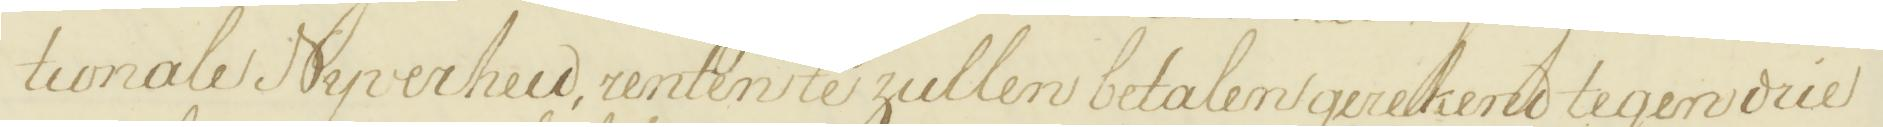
tionale Nyverheid, renten te zullen betalen gerekend tegen drie
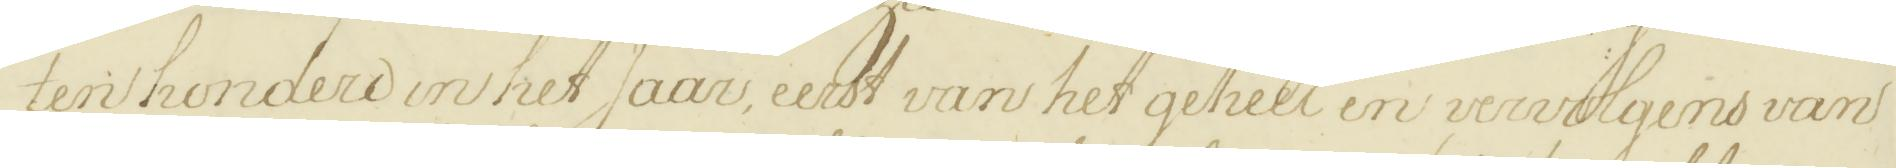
ten honderd in het Jaar, eerst van het geheel en vervolgens van
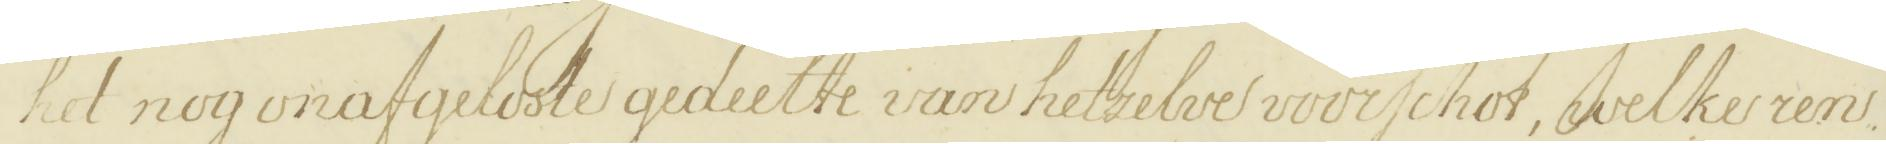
het nog onafgeloste gedeelte van hetzelve voorschot, welke ren„
